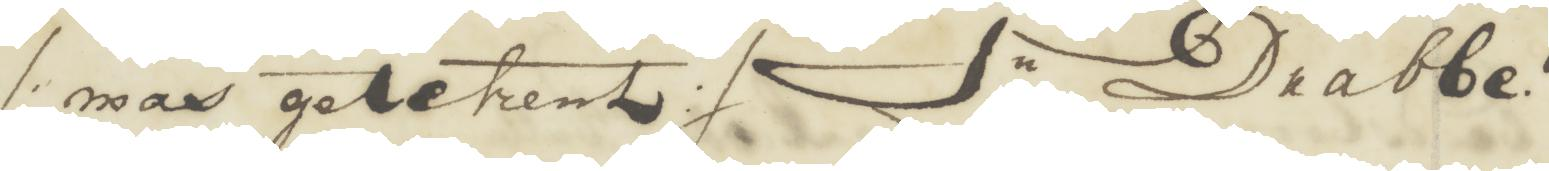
/: was getekent :/ J„r Drabbe.
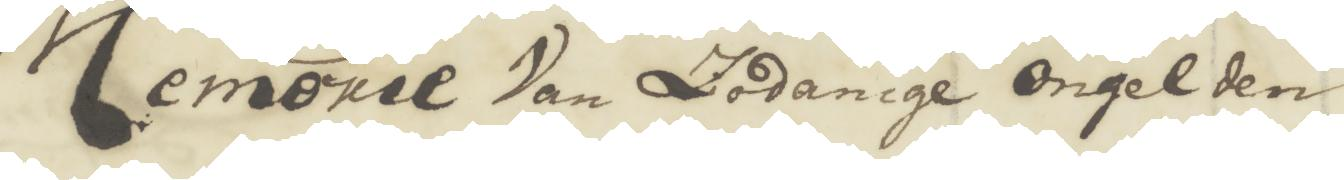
Memorie Van zodanige ongelden
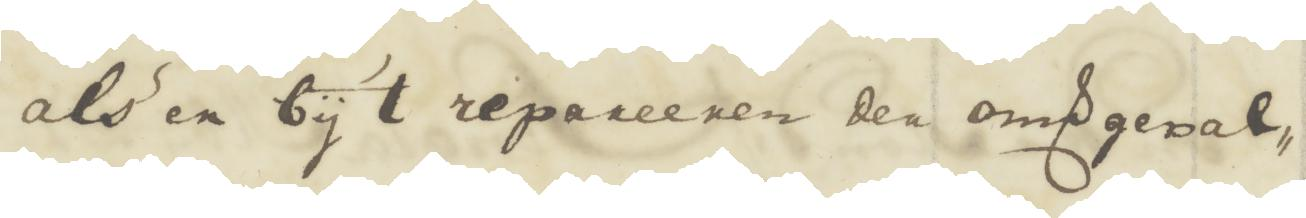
als'er bij ’t repareeren der omvergeval„
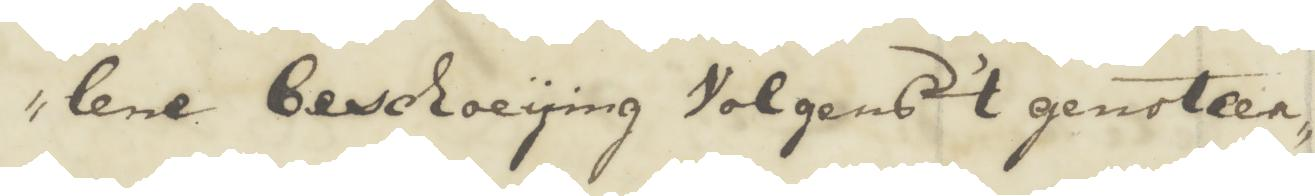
„lene beschoeijing Volgens ’t genoteer„
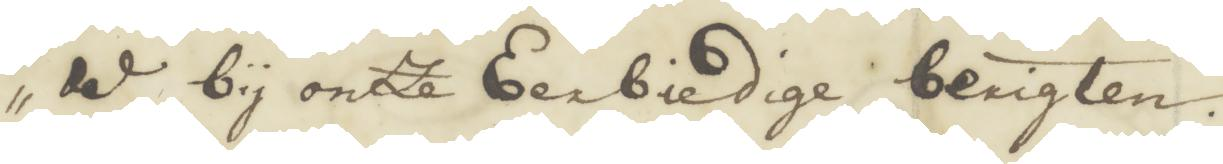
„de bij onze Eerbiedige berigten
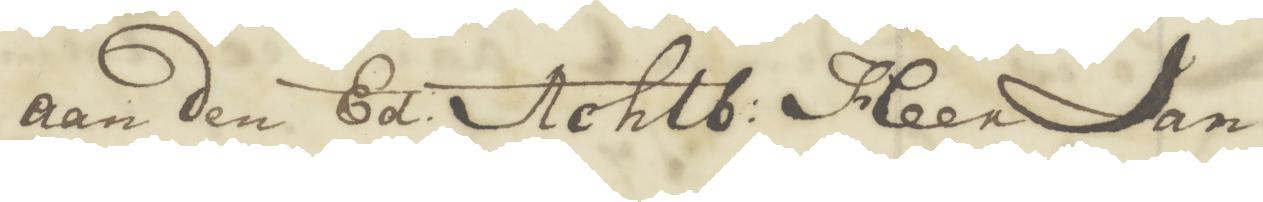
aan den Ed: Achtb: Heer Ian
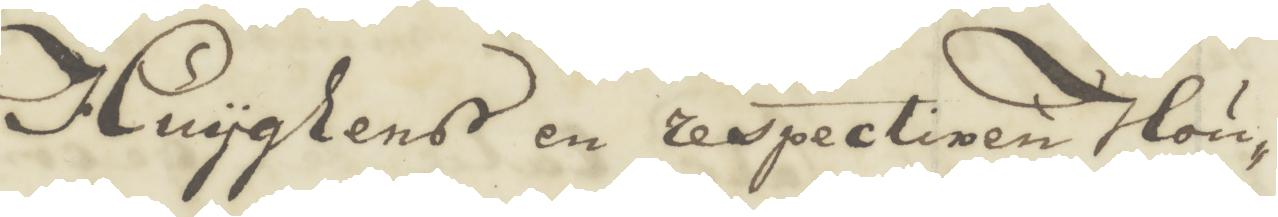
Huijghens en respectiven Hou„
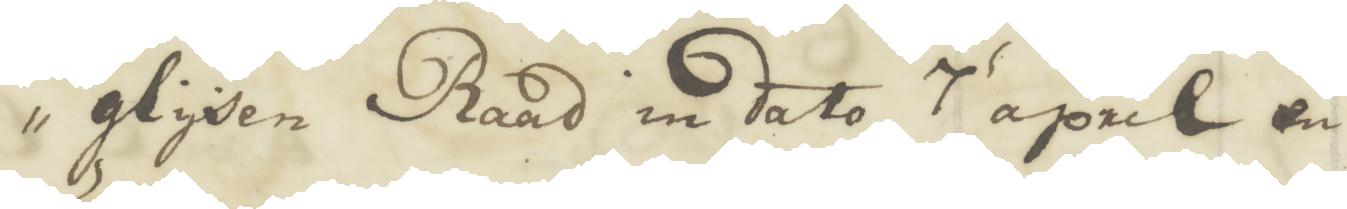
„glijsen Raad in dato 7' april en
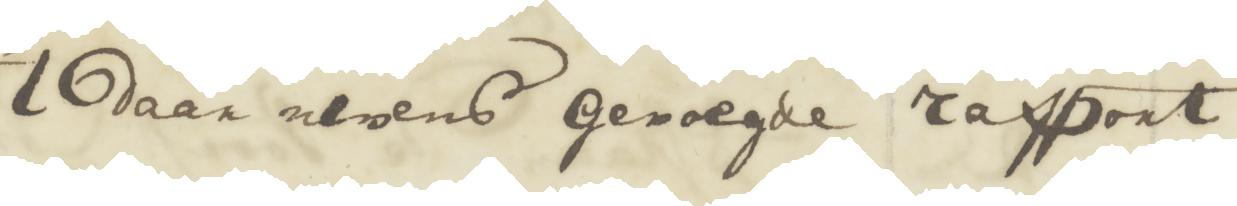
’t daar nevens gevoegde rapport
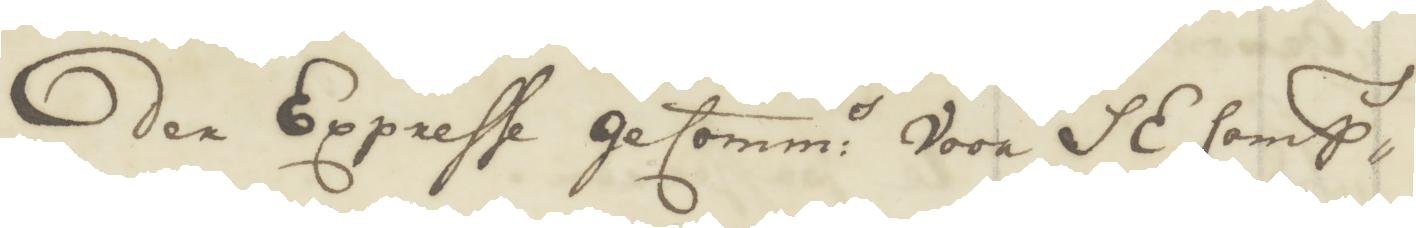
der Expresse gecomm:s voor 's E Comp„s
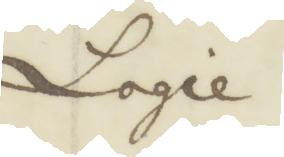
Logie
